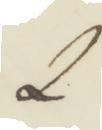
„ 2 =
